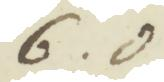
6. d
